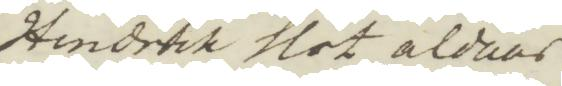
Hendrik slot aldaar
